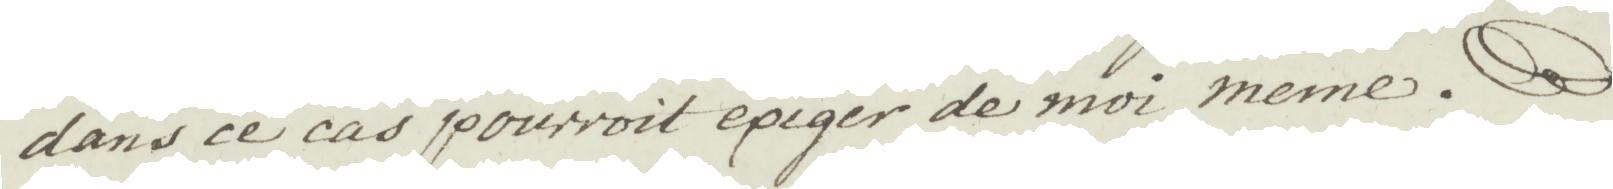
dans ce cas pourroit epiger de moi meme.
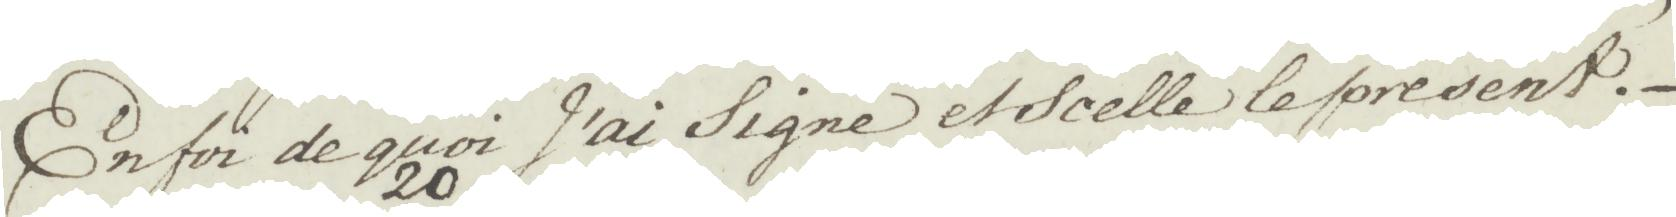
Enfoi de quoi J'ai Signé et Scellé le present.-
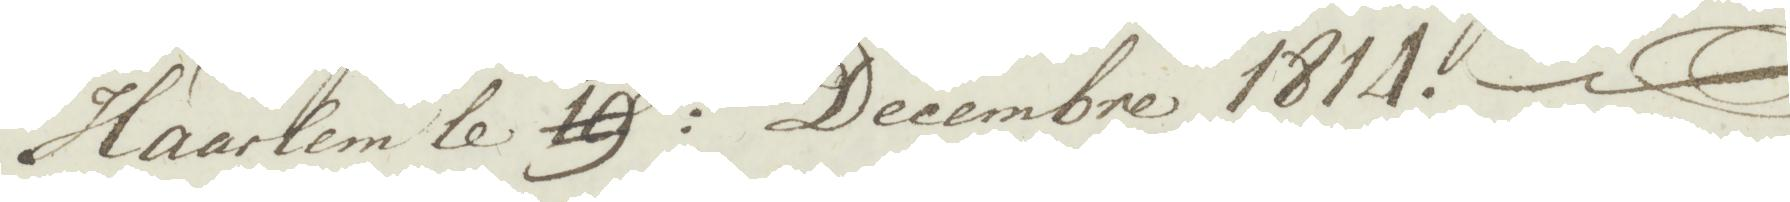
Haarlem le 19 me Decembre 1814.
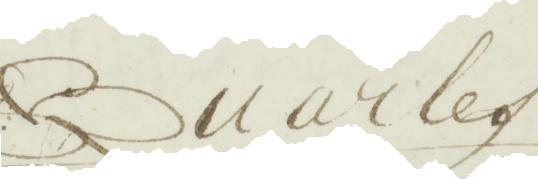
Quarles
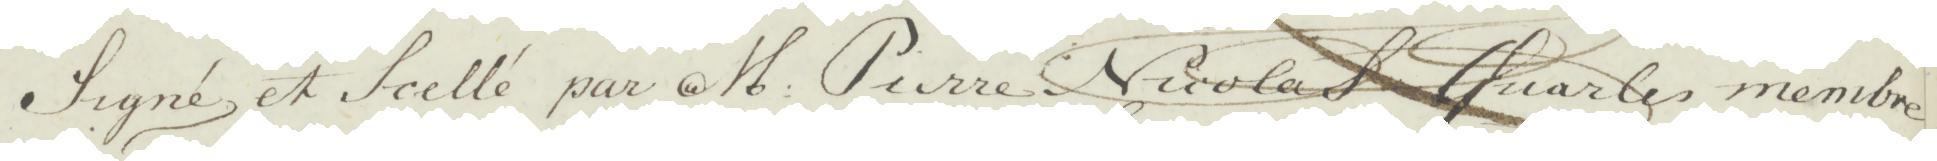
Signe et Scellé par M: Pierre Nicolas Quarles membre
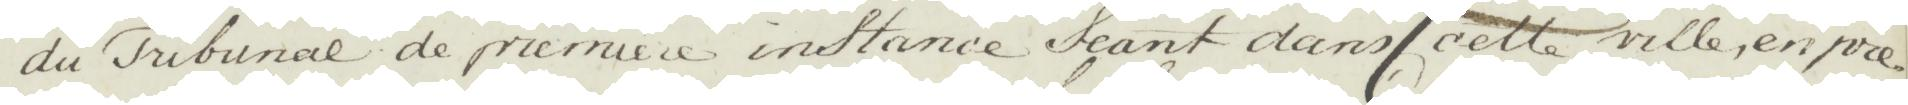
du Tribunal de premiere instance Seant dans cette ville, en pre
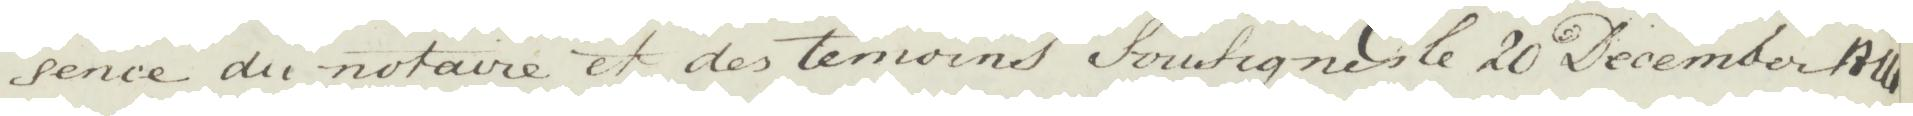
sence du notaire er des témoins Sousignés le 20 December 1814
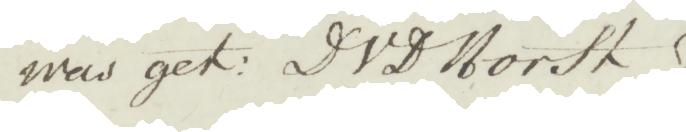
was get: DVD Horst
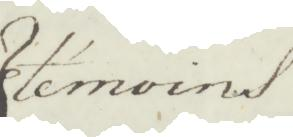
témoins
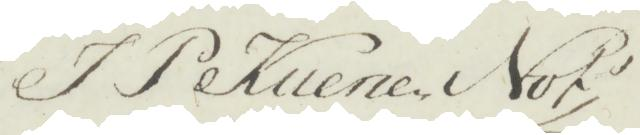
J P Kuene Nots
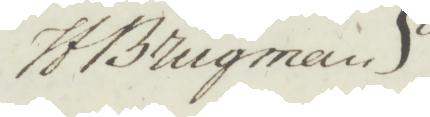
H Brugman )
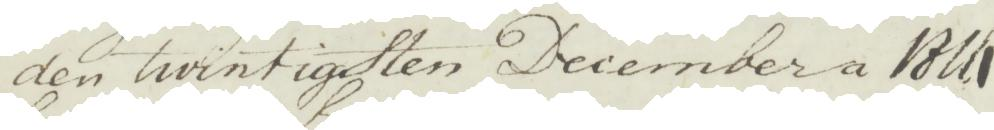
den twintigsten December a 1814
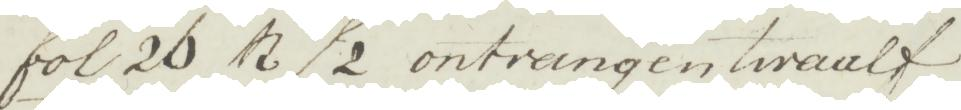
Fol 26 K f2 ontvangen twaalf
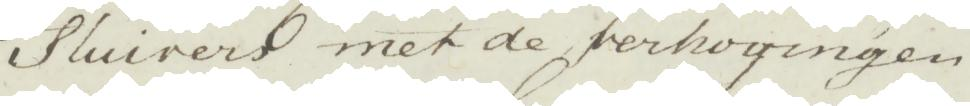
Stuivers met de verhogingen
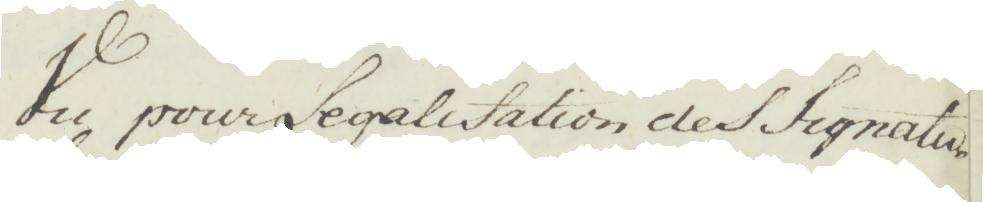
Vu pour Legalisation des Signatu
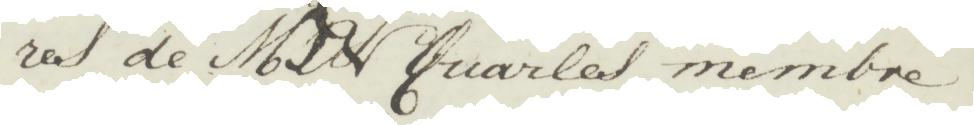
re de MLV Quarles membre
